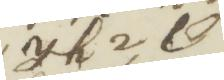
yhvl
